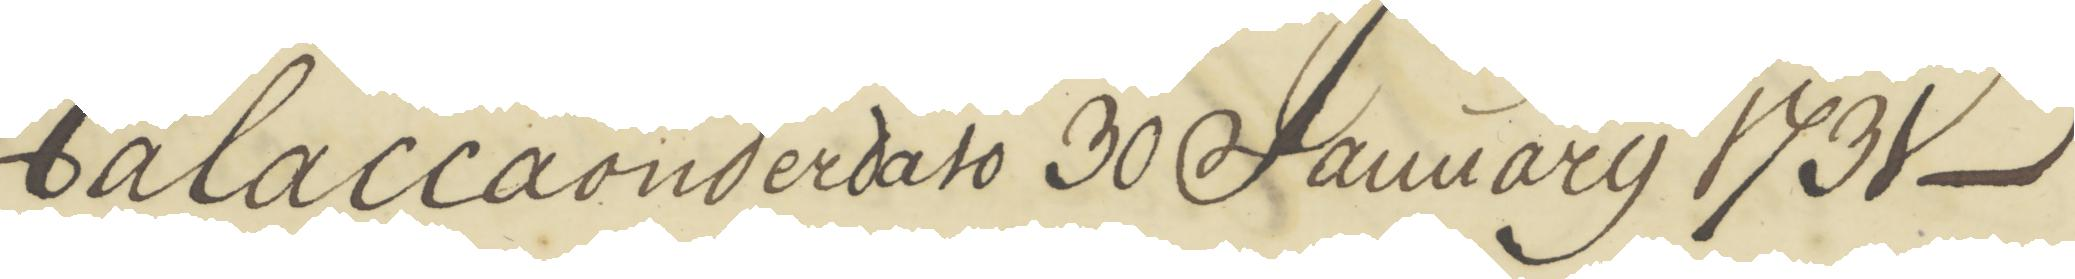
Van Malacca onderdato 30 Januarij 1731
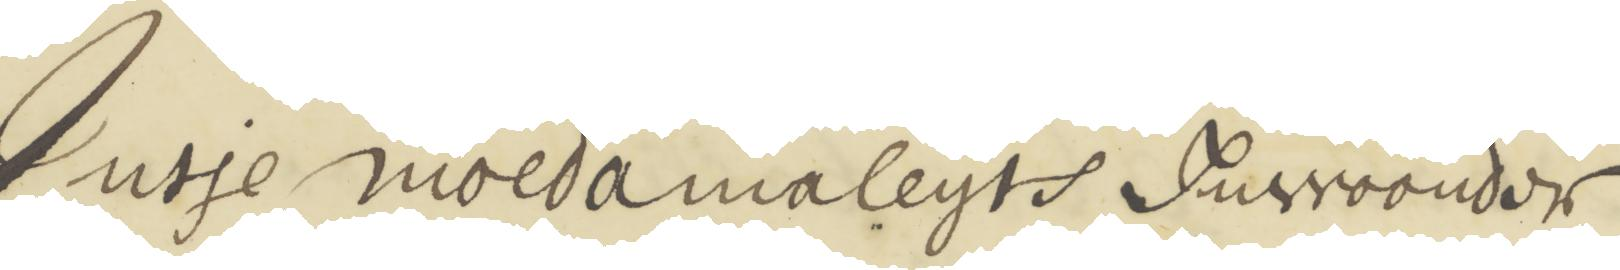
den 29 9ber Jntje moeda maleijts jnwoonder
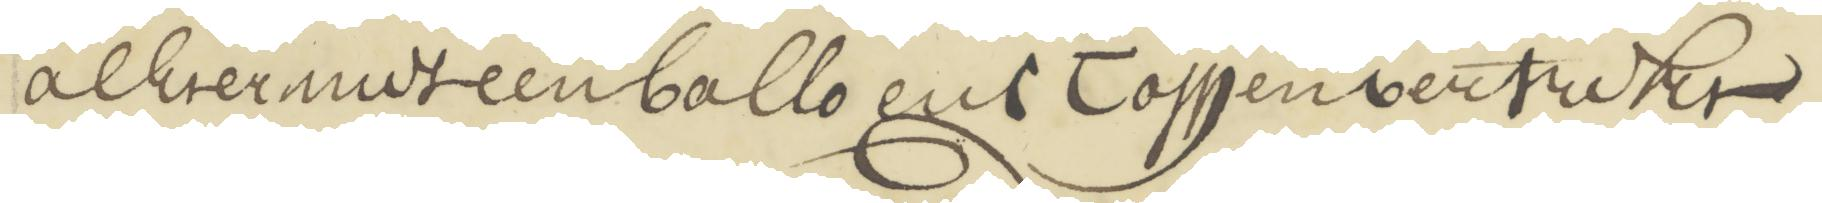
alhier met een ballo en 5 coppen vertrekt
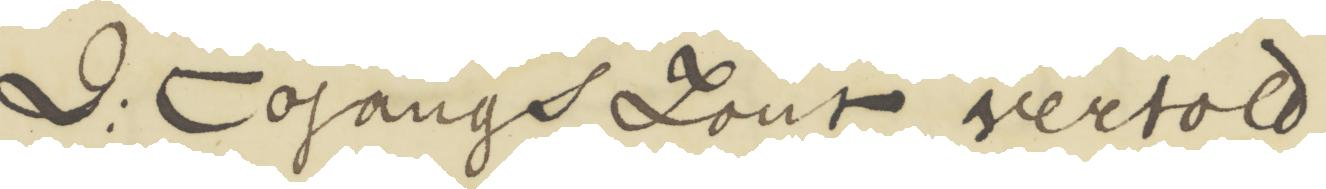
2: cojangs zout vertold
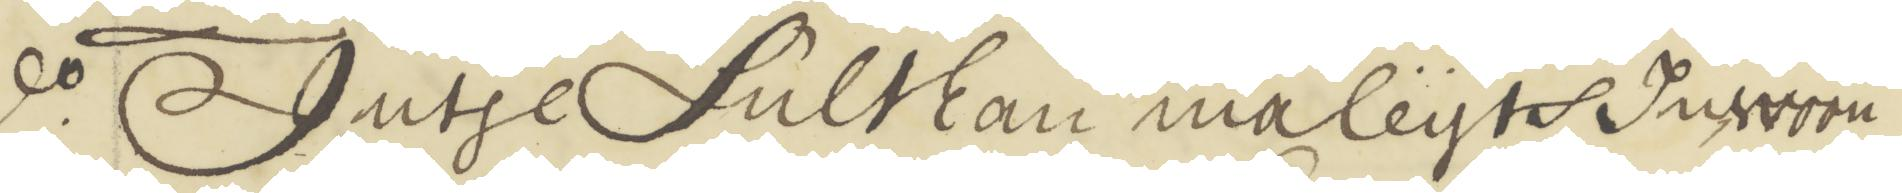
„ _:o Jntje sulthan maleijts jnwoon
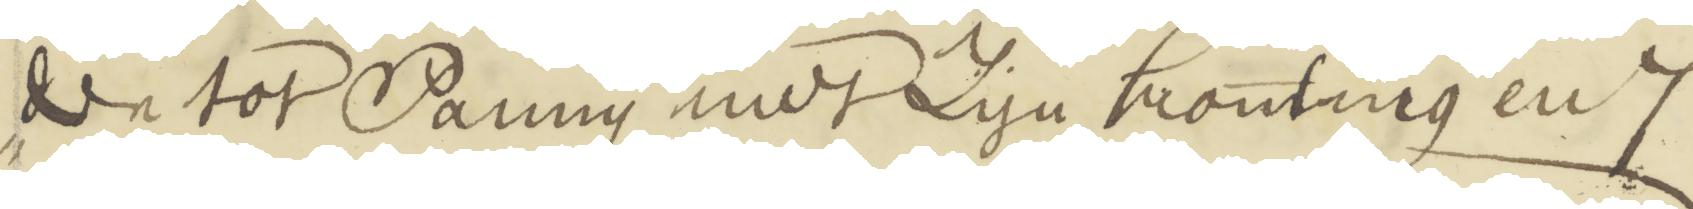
„der tot Pannij met zijn konting en 7
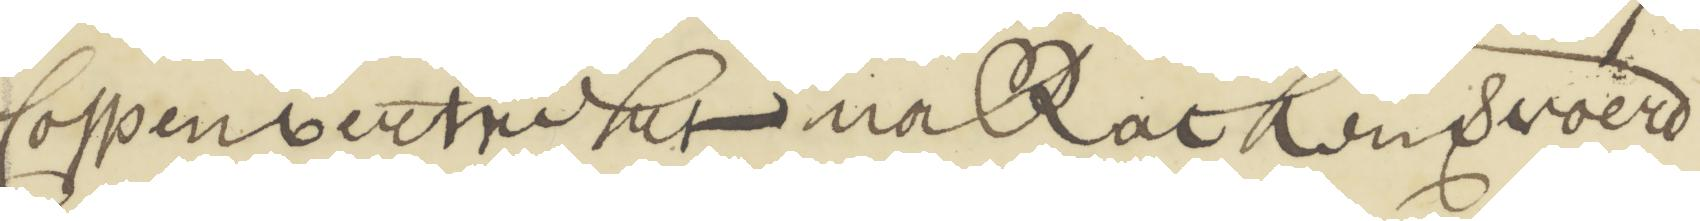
coppen vertrekt na Racken vervoerd
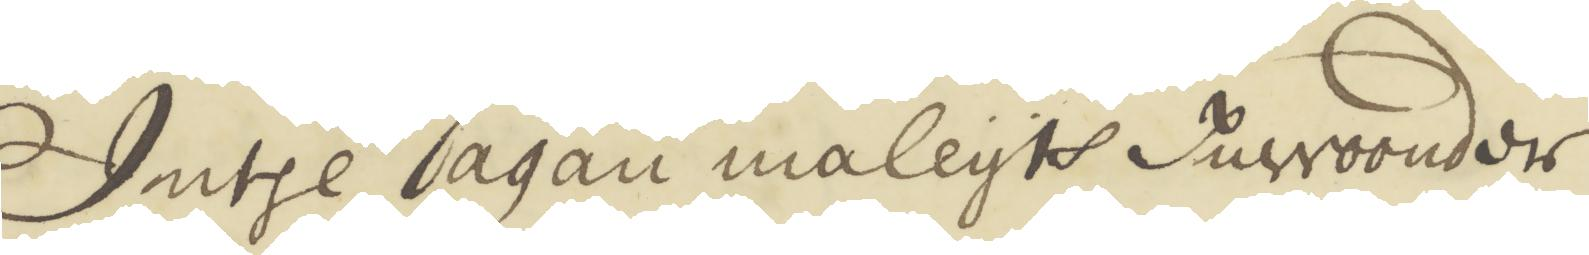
12. decemb: Jntje dagan maleijts jnwoonder
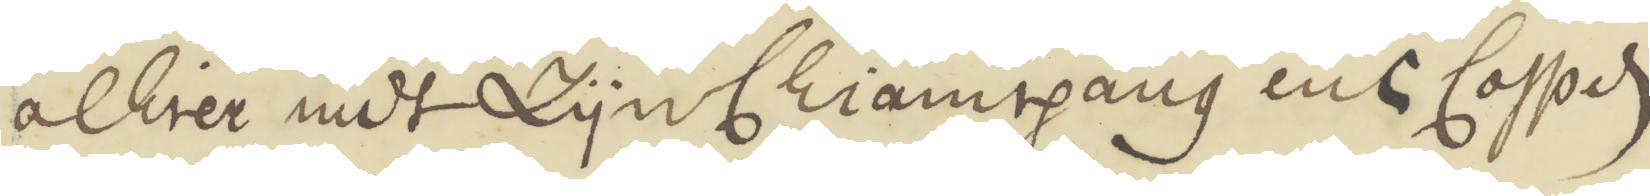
alhier met zijn chiampang en 5 coppen
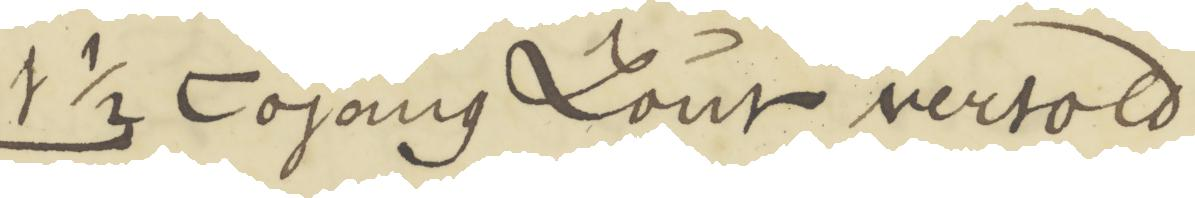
1½ cojang zout vertold
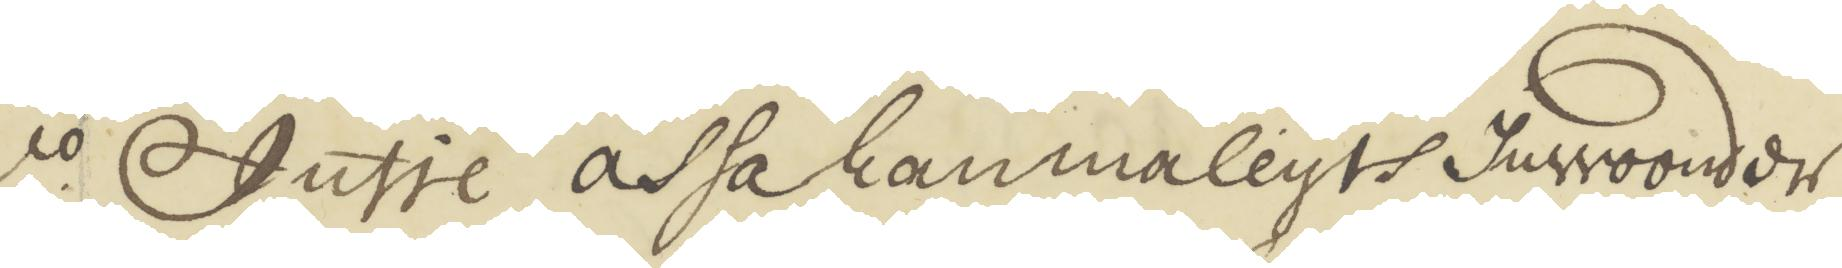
4 _:o Jntje assahan maleijts jnwoonder
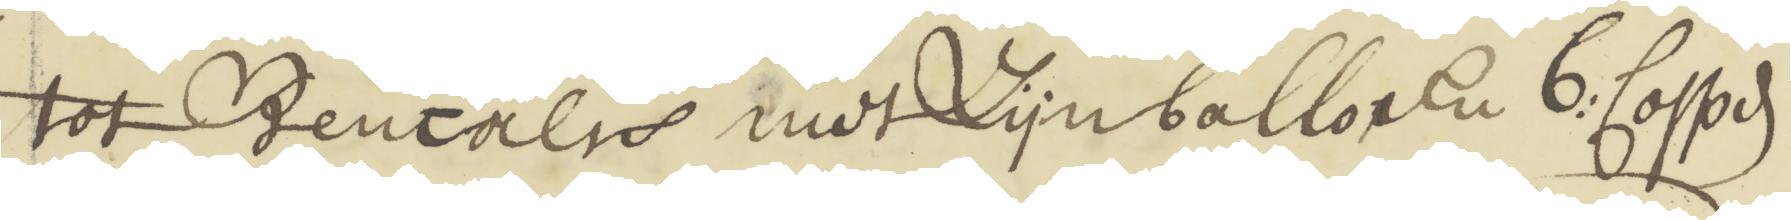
tot Bencalis met zijn ballo En 6: coppen
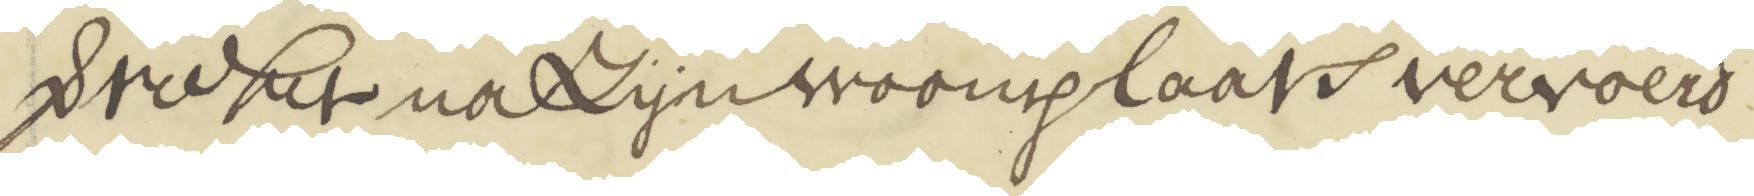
vertrekt na zijn woonplaats vervoerd
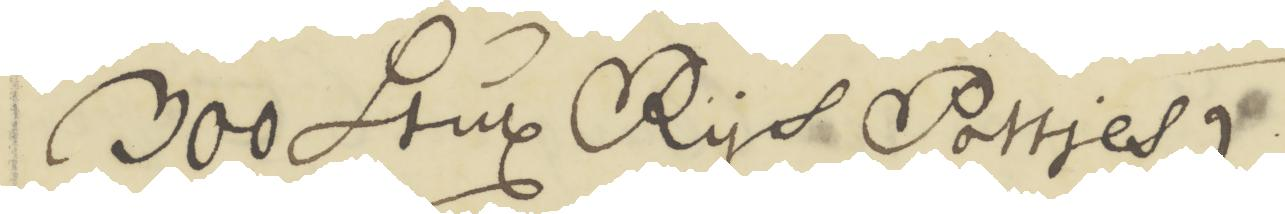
300 stux Rijs Pottjes
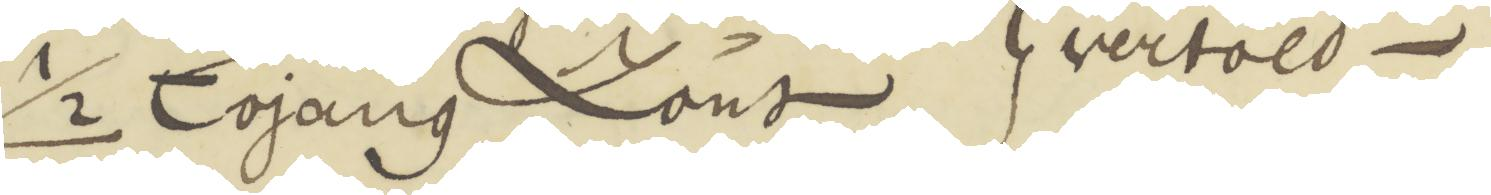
½ cojang zout vertold
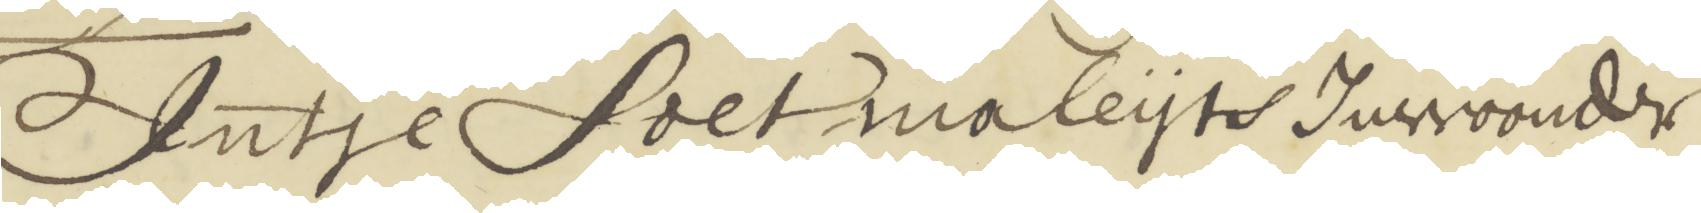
5 _:o Jntje Soet maleijts jnwoonder
